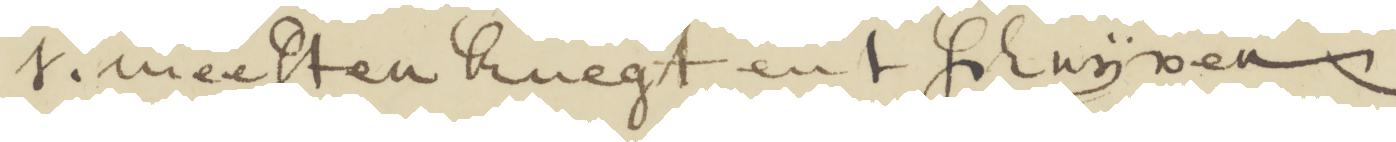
1. meester knegt en ’t schrijver
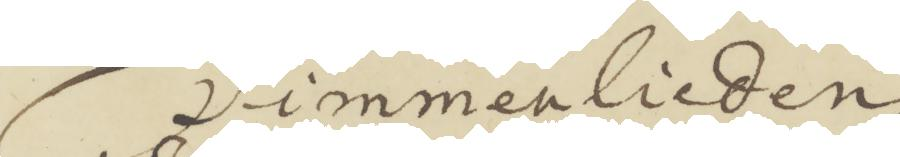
Timmerlieden
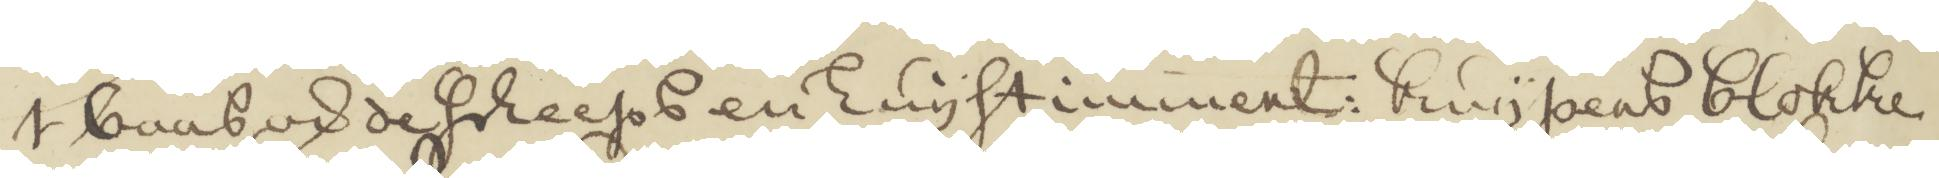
1 baas over de scheeps en huijstimmerl: kuijpers blokke
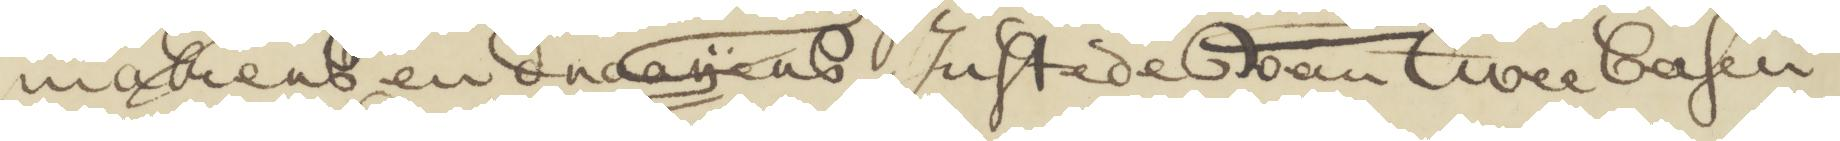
makers en draaijers Jnstede van twee basen
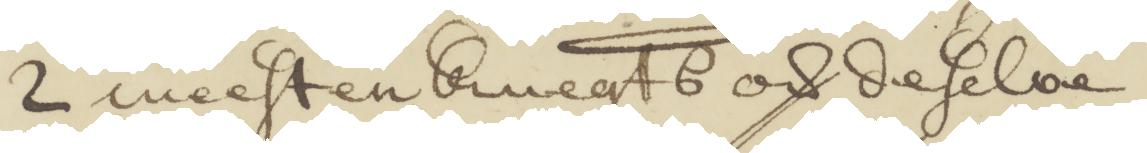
2 meester knegts over deselve
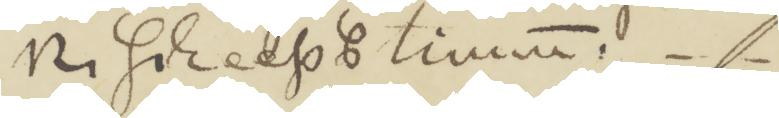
12. scheeps timm: - -
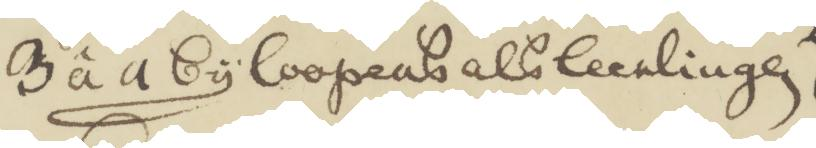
3 â 4 bij loopers als leerlingen
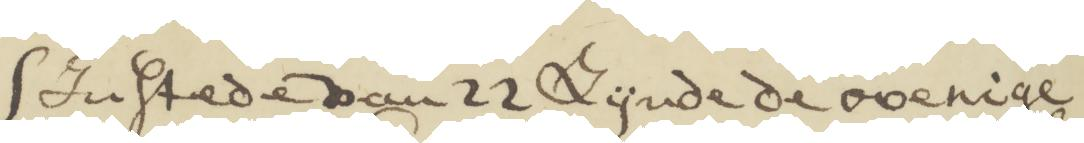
Instede van 22 zijnde de overige
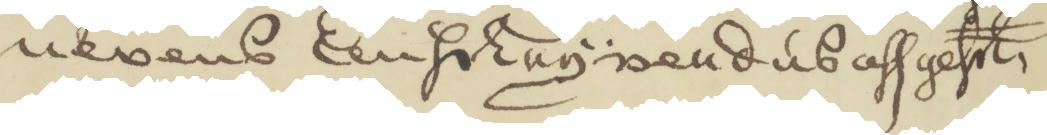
nevens Een schrijver dus affgesch:
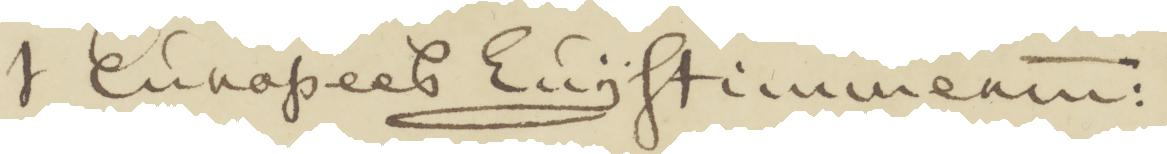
1 Europees huijstimmerm:
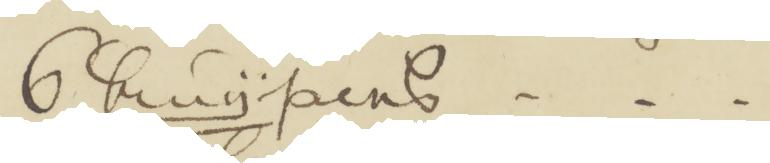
6 kuijpers - - -
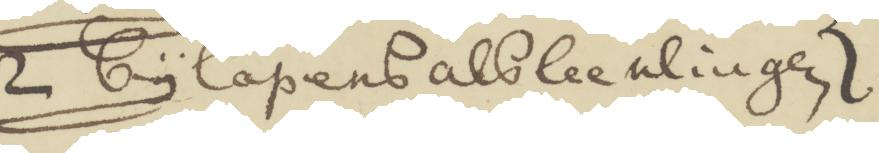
2 bij lopers als leerlingen
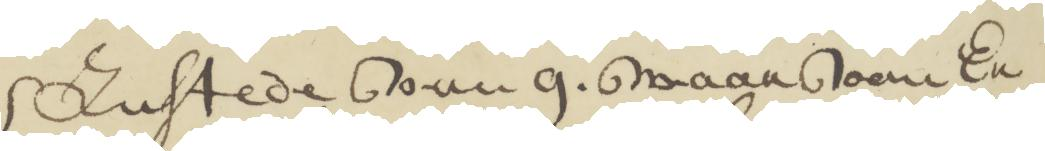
Instede van 9. waar van Er
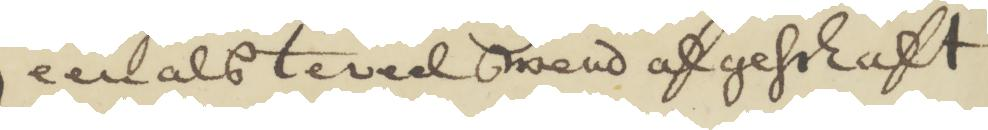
een als teveel werd afgeschaft
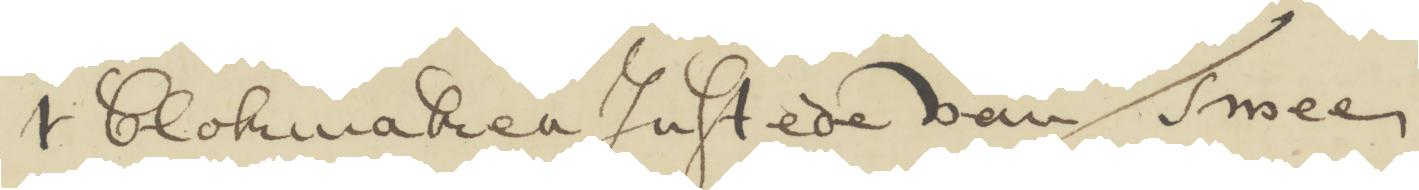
1 blokmaker Jnstede van Twee
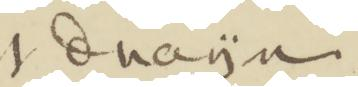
1 draijn
